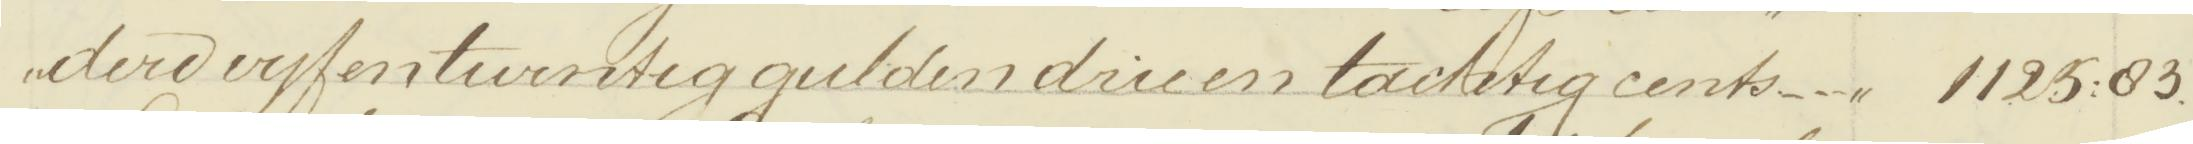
„derd vyf en twintig gulden drie en tachtig cents. ---„ 1125:83.
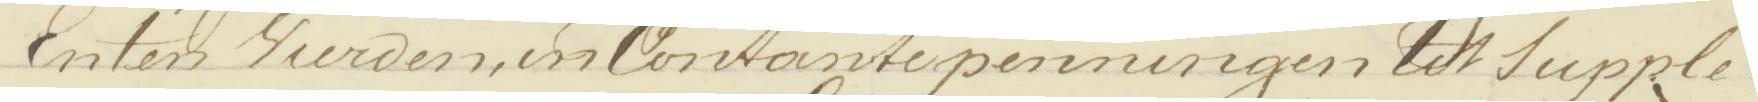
En ten Vierden, in Contante penningen tot supple
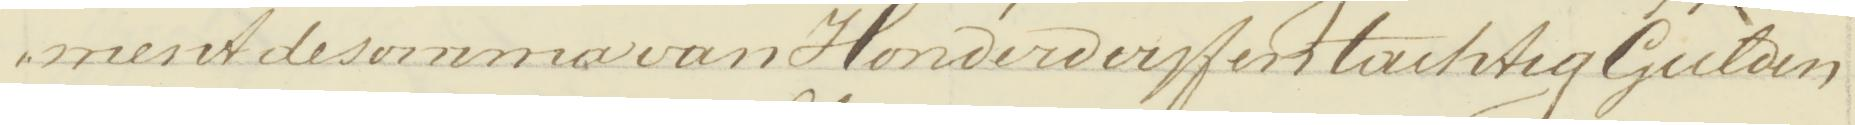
„ment de somma van Honderd vyf en tachtig Gulden
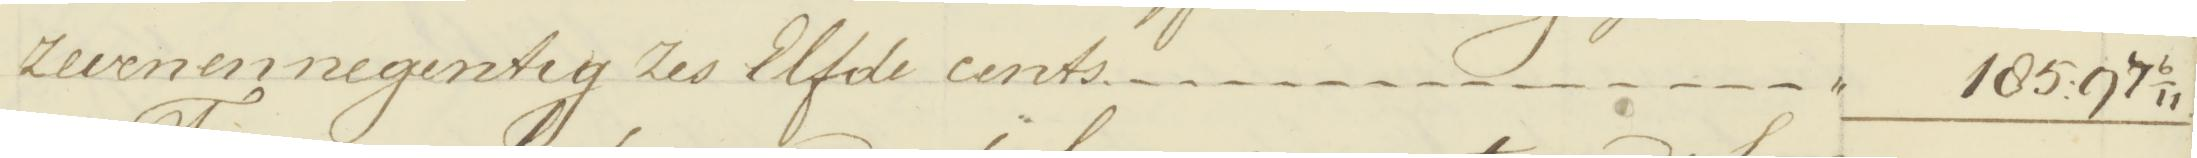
zeven en negentig zes Elfde cents.- - - - - - - - - - - - - - - - „ 185:97 6/11
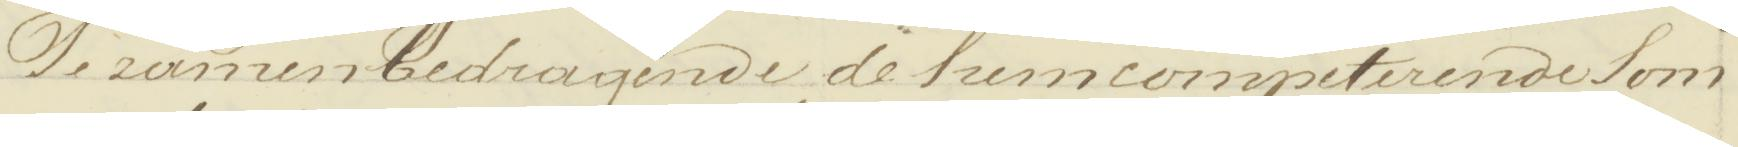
Tezamen bedragende de hem competerende Som
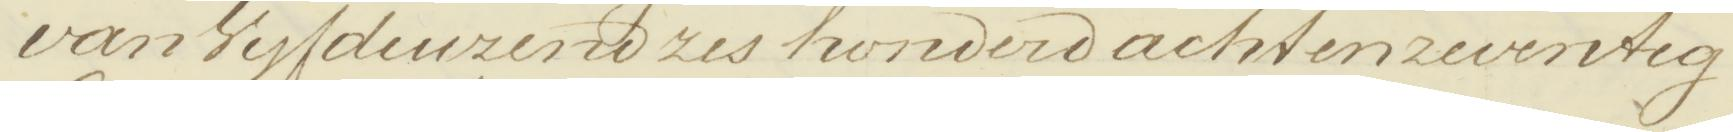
van Vyfduizend zes honderd acht en zeventig
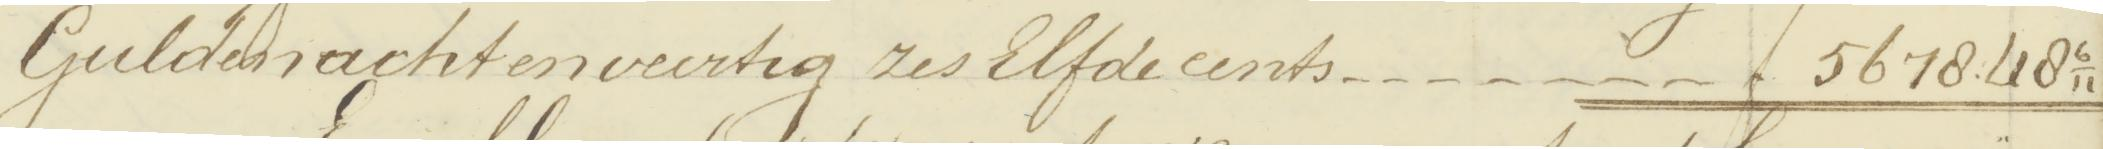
Gulden acht en veertig zes Elfde cents - - - - - - - -ƒ 5678:48 6/11
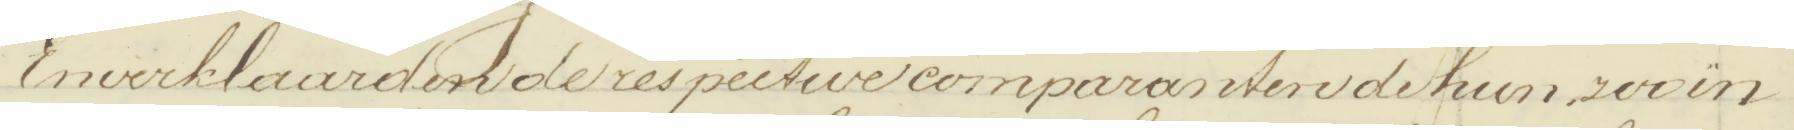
En verklaarden de respective comparanten de hun, zoo in
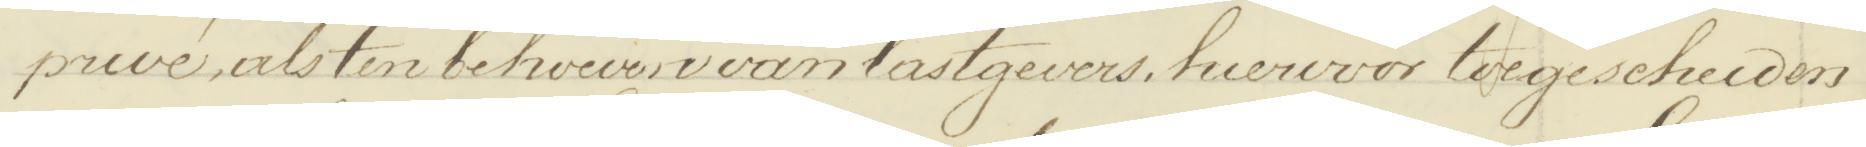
privé, als ten behoeven van lastgevers, hiervoor toegescheiden
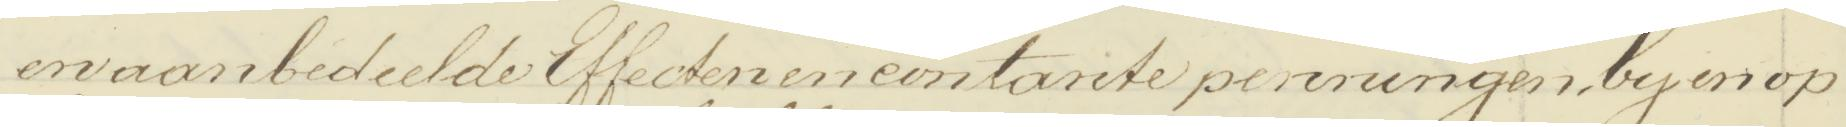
en aanbedeelde Effecten en contante penningen, by en op
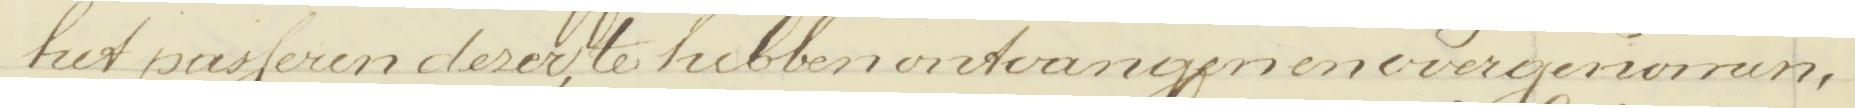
het passeren dezer, te hebben ontvangen en overgenomen,
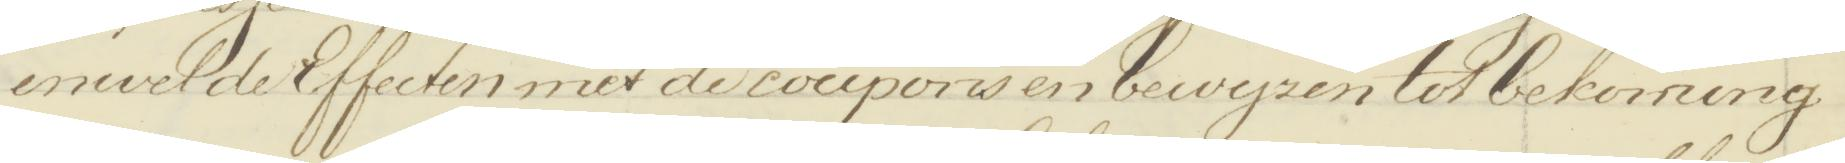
en wel de Effecten met de coupons en bewyzen tot bekoming
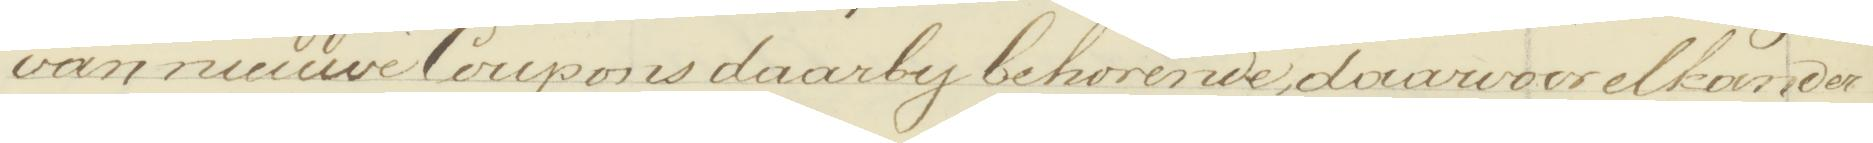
van nieuwe Coupons daarby behorende, daarvoor elkander
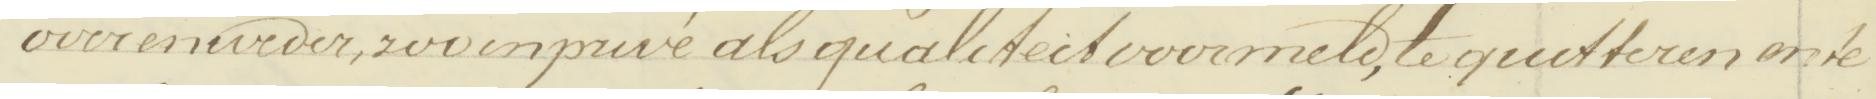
over en weder, zoo in privé als qualiteit voormeld, te quitteren en te
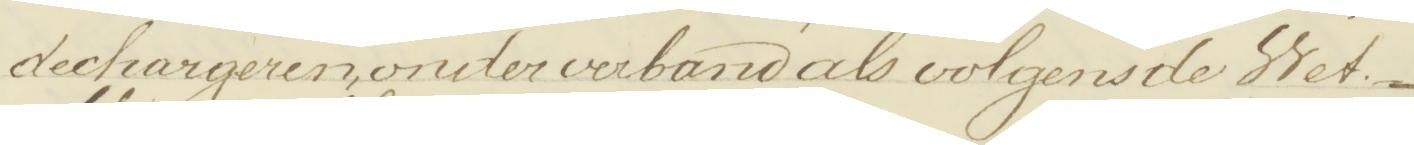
dechargeren, onder verband als volgens de Wet.
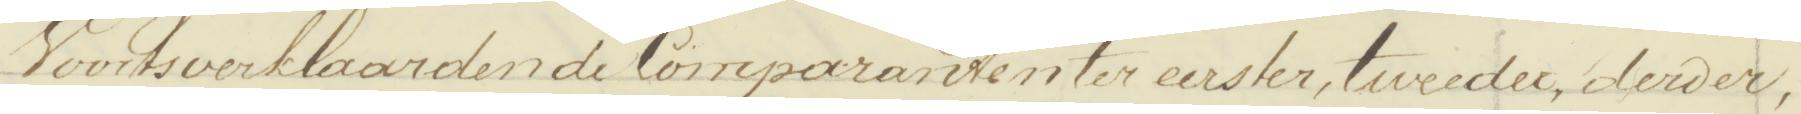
Voorts verklaardende Comparanten ter eerster, tweeder, derder,
